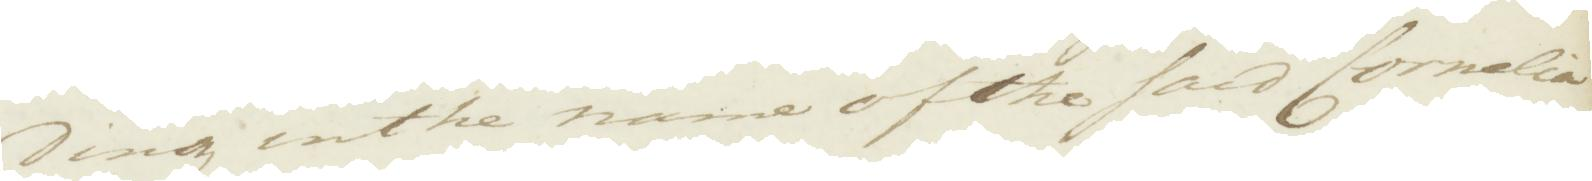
ding in the name of the said Cornelia
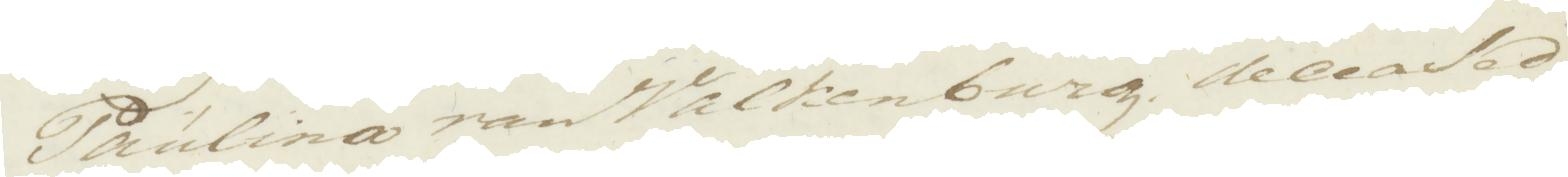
Paulina van Valkenburg, deceased
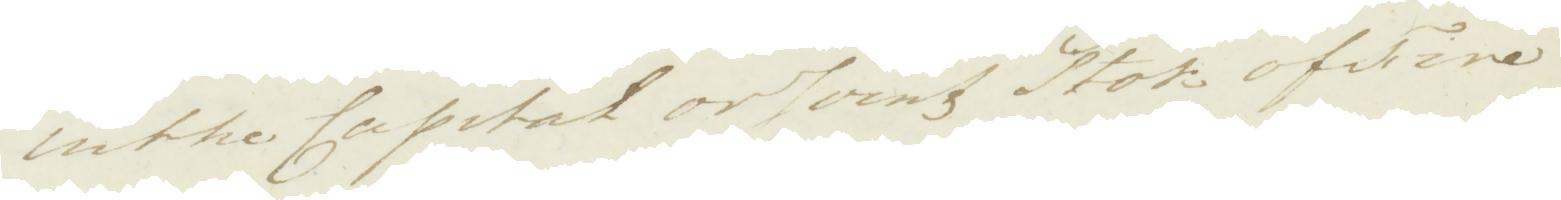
in the Capital or Joint Stok of Five
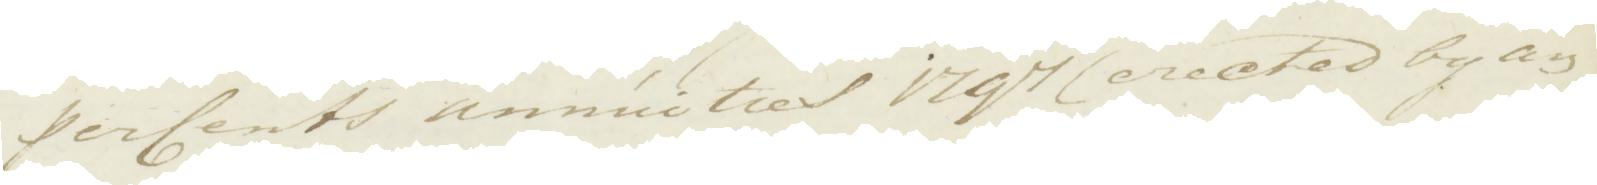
per Cents annuities 1797 (created by an
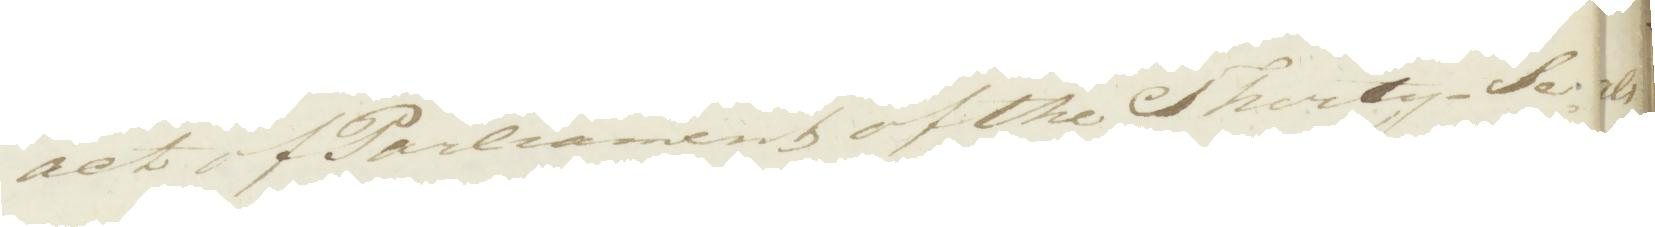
act of Parliament of the Thirty-Sev
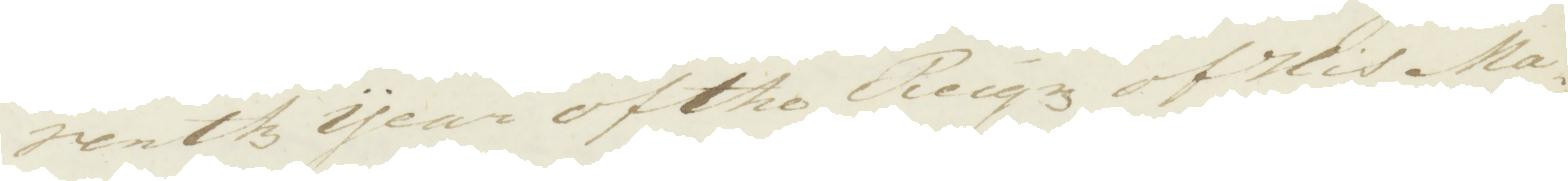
venth IJear of the Reign of His Ma„
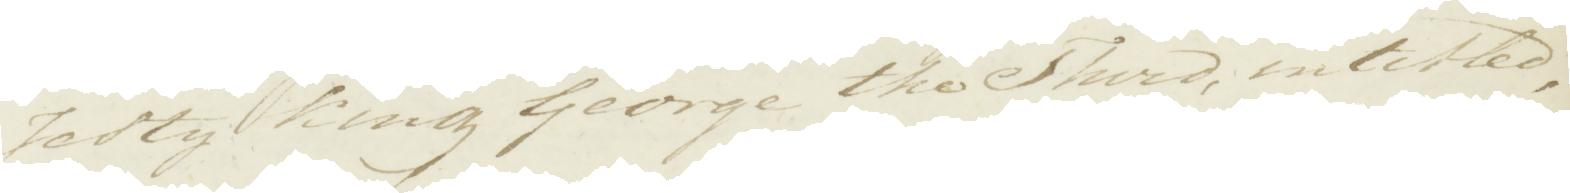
Jesty King George the Third, entitled,
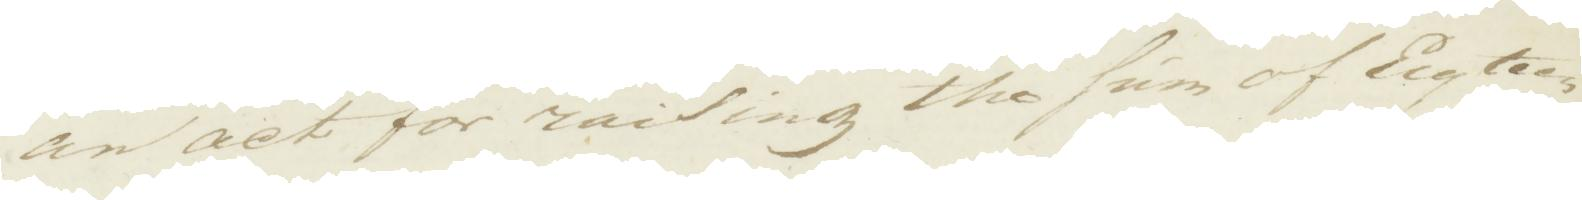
an act for raising the Sum of Eigteen
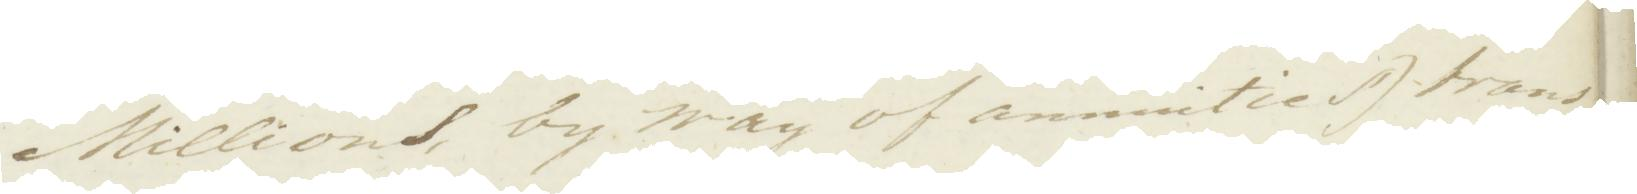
Millions, by way of annuities) trans
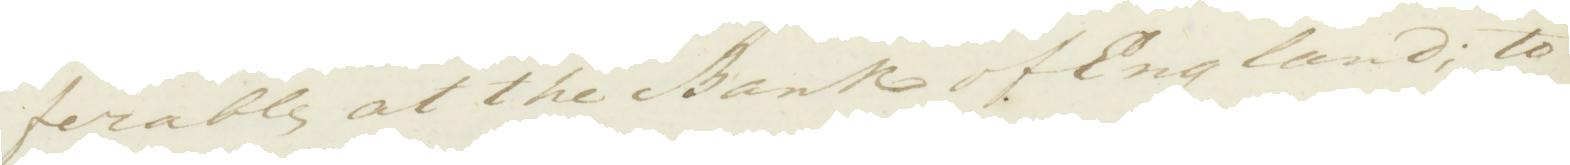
ferable at the Bank of England; to
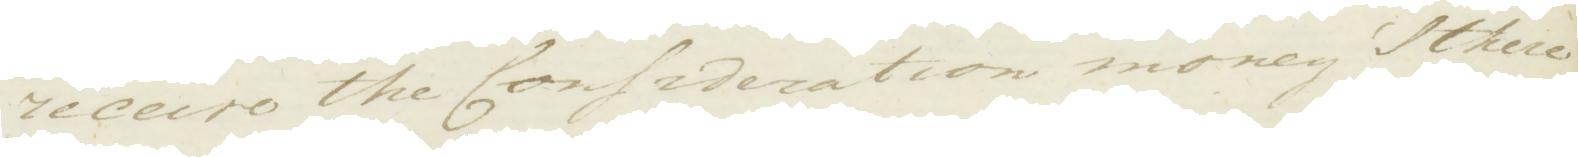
receive the Consideration money 's there
